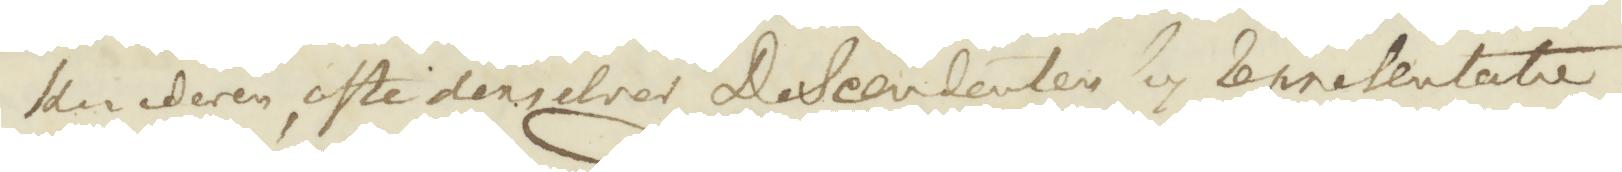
kinderen, ofte derselver Descendenten by representatie
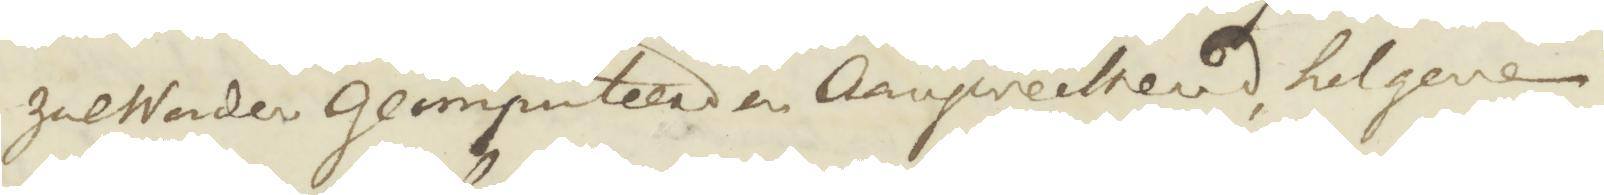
zal werden geimputeerd en Aangereekend, hetgene
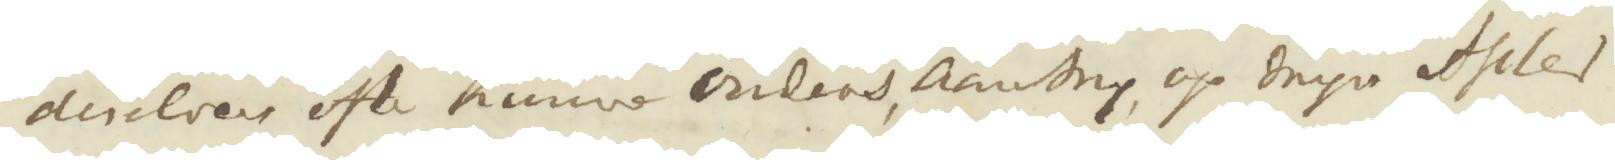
deselven ofte hunne ouders, aan my op myn Afster
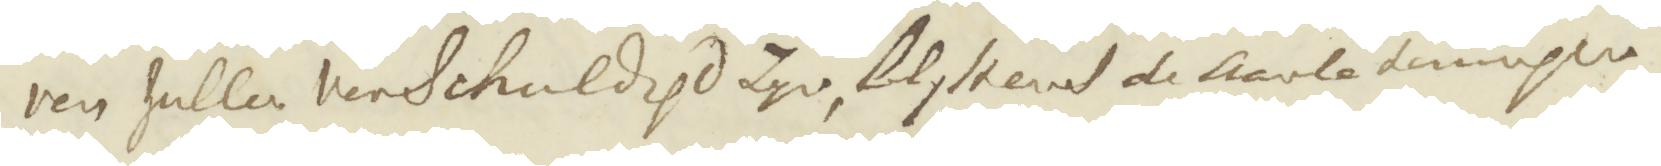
ven zullen verschuldigd zyn, blykens de aantekeningen
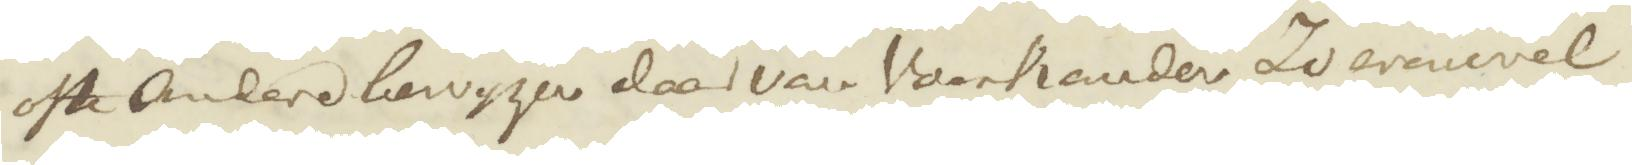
ofte andere bewyzen daar van voorhanden zo evenwel
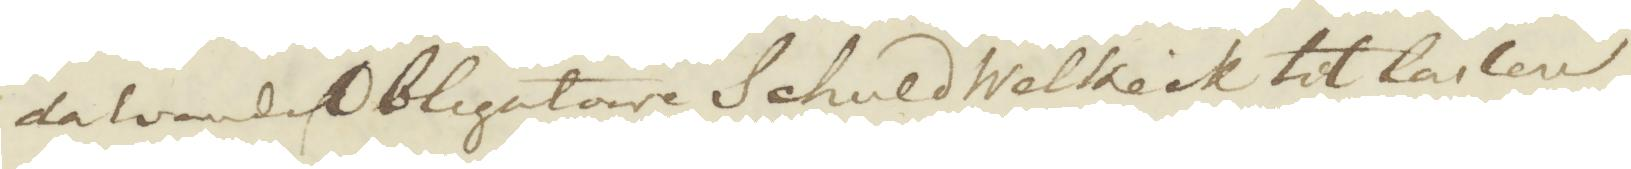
dat van de Obligatoire Schuld welke ik tot lasten
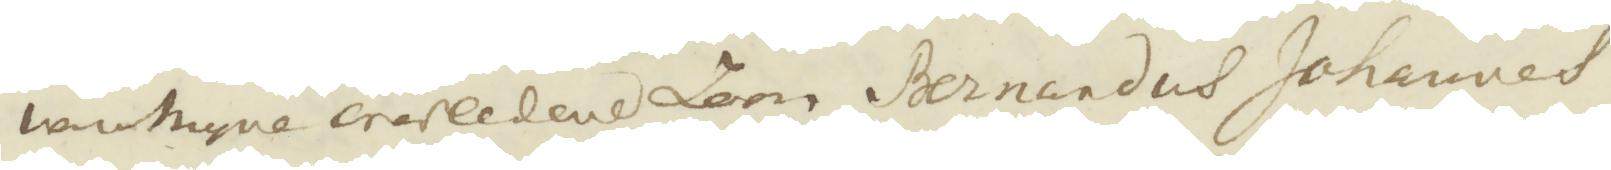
van myne overledene zoon Bernardus Johannes
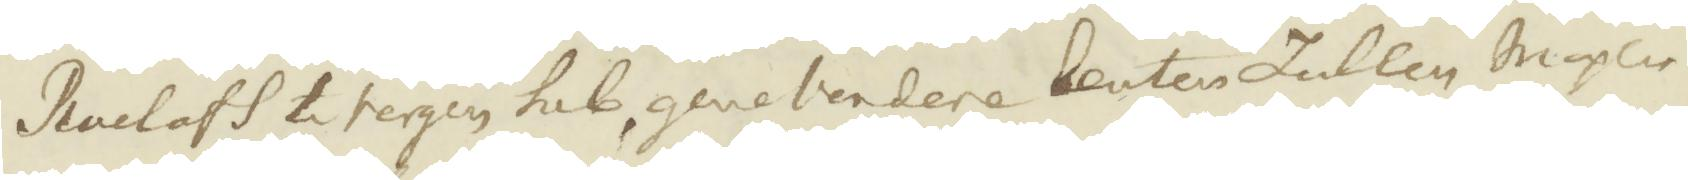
Roelofs te vergen heb, gene verdere kosten zullen mogen
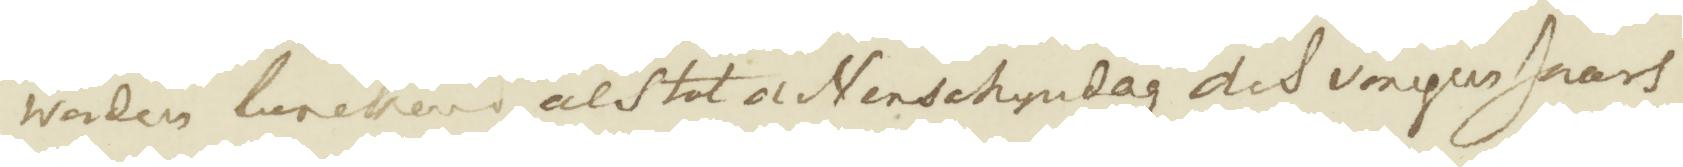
worden berekend als tot de Verschyndag des vorigen Jaars
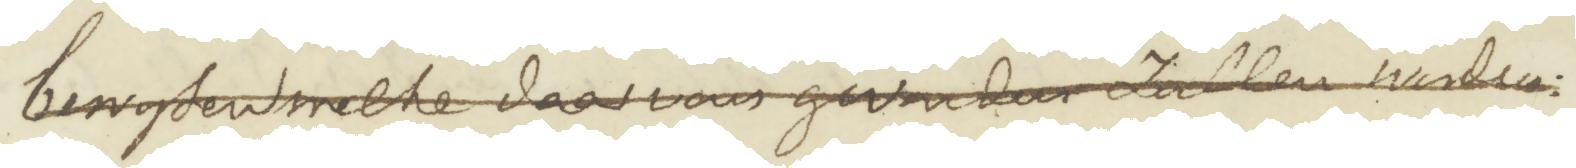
bewysen welke daar voor gevonden zullen worden
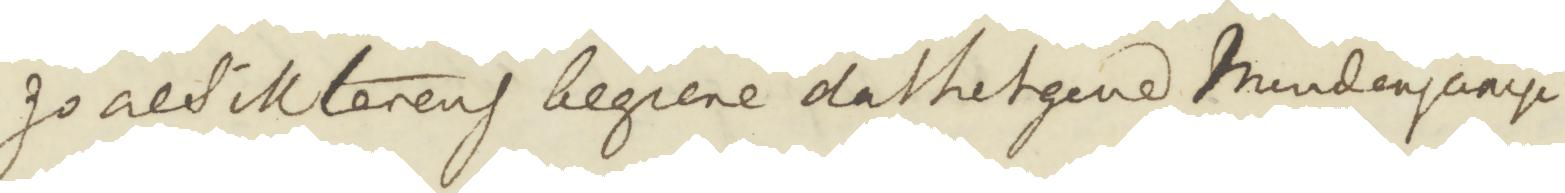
zo als ik tevens begeere dat hetgene Minderjarige
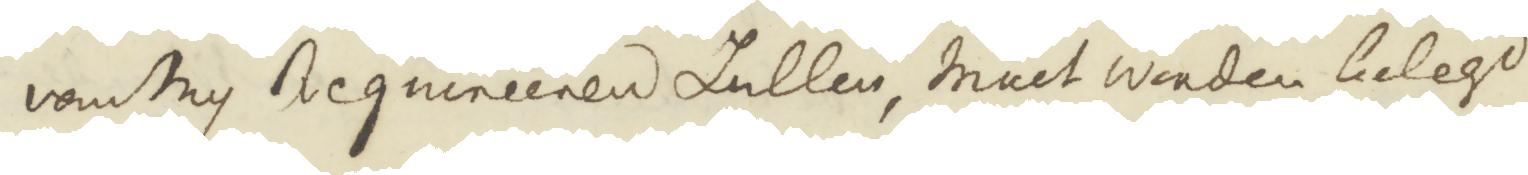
van my Requireeren Zullen, moet werden belegd
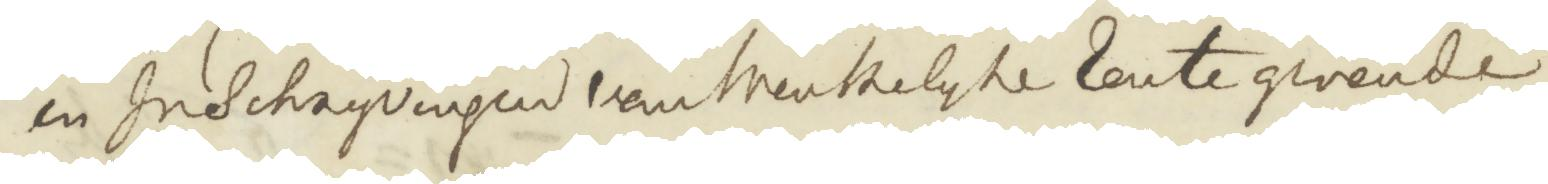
in Jnschryvingen van werkelyke rente gevende
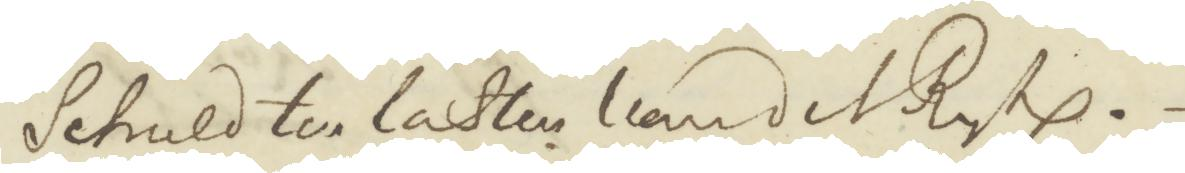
schuld ten lasten van dit Ryk.
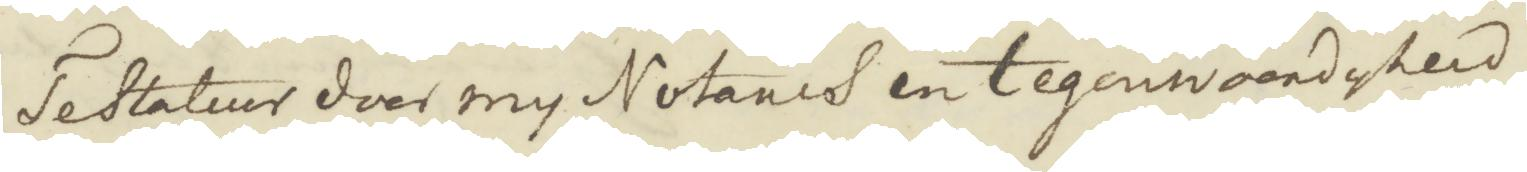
Testateur door my Notaris in tegenwoordgheid
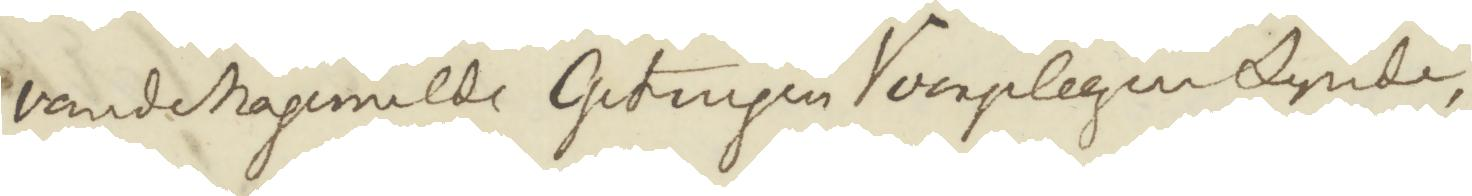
van de nagemelde Getuigen Voorgelezen zynde,
